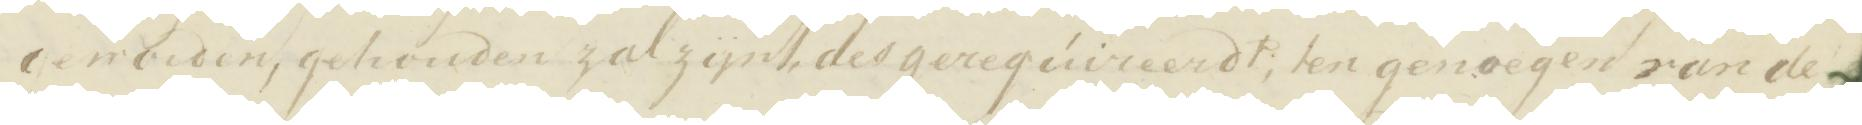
geworden, gehouden zal zijn, des gerequireerdt, ten genoegen van de
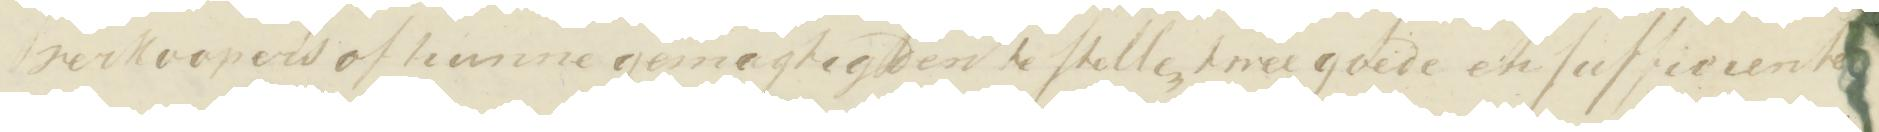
verkoopers of hunne gemagtigden te stellen twee goede en sufficiente
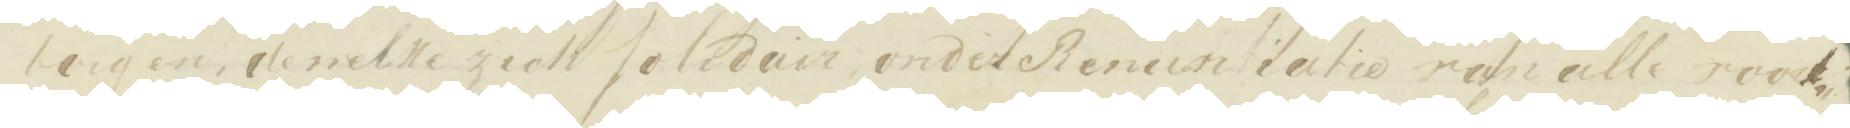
borgen, dewelke zich solidair, onder Renuniatie van alle voor
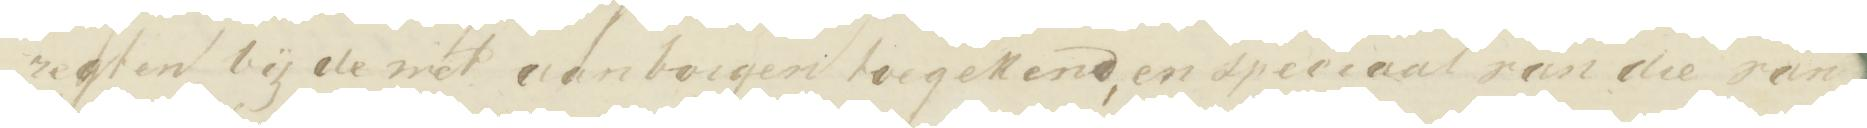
regten bij de wet aan borgen toegekend, en speciaal van die van
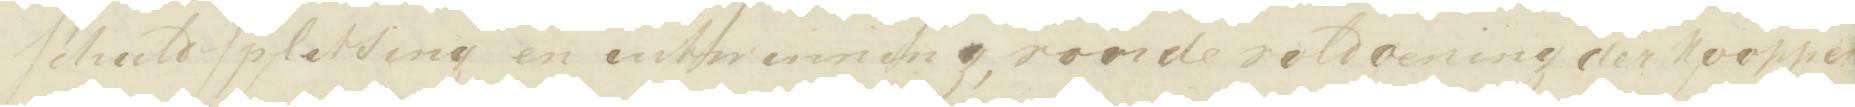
schuld splitsing en en uitwinning, voor de voldoening der kooppe
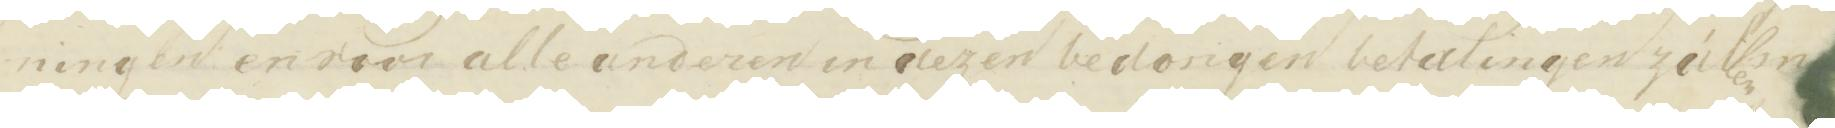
ningen en voor alle anderen in dezen bedongen betalingen zullen
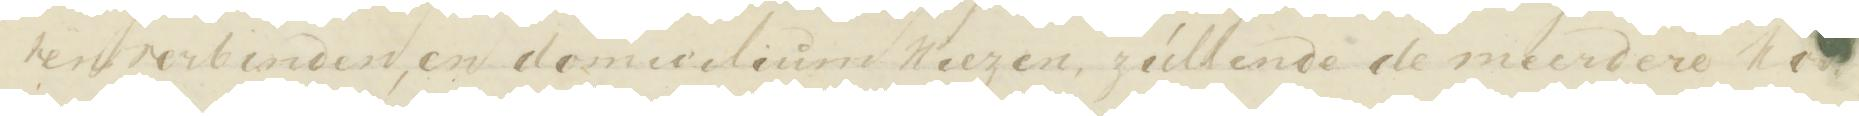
ten verbinden, en domicilium kiezen, zullende de meerdere ko
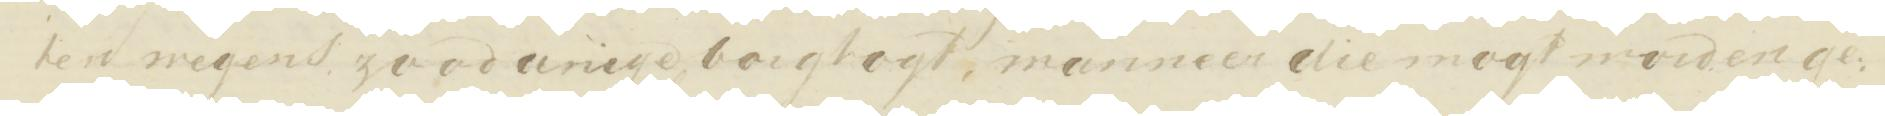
ten wegens, zoodanige, boegkogt, wanneer die mogt worden ge„
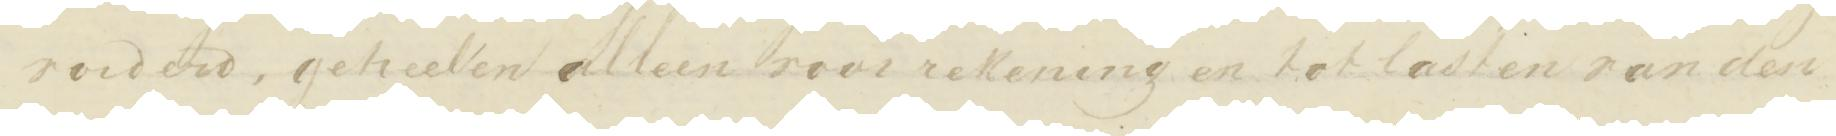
vorderd, geheelen alleen voor rekening en tot lasten van den
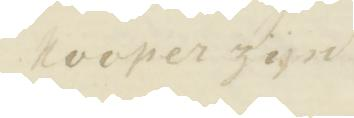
kooper zijn
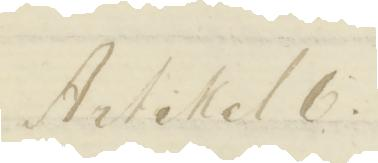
Artikel 6
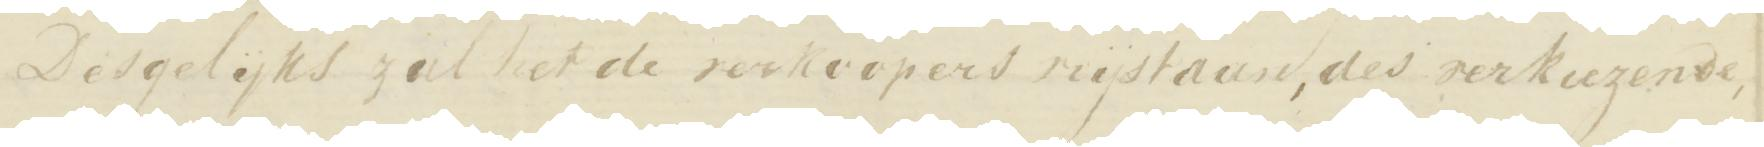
Desgelijks zal het de verkoopers vrij staan, des verkiezende,
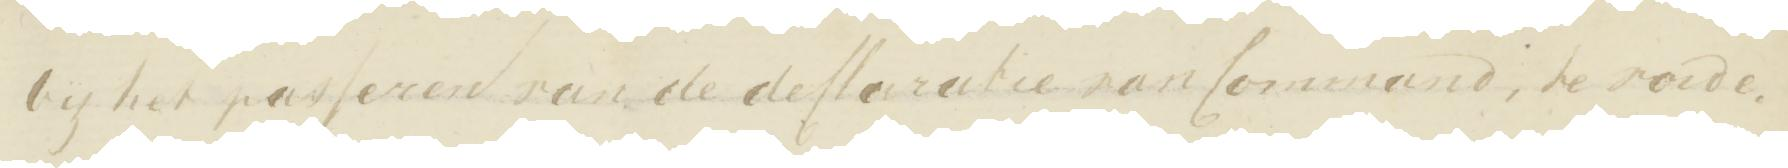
bij het passeren van de declaratie van Command, te vorde„
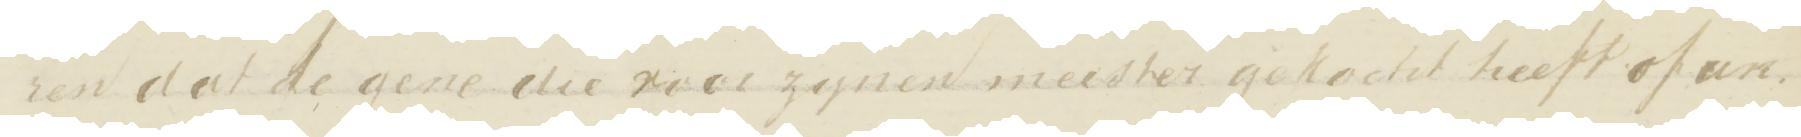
ren dat de gene die voor zynen meester gekocht heeft of an„
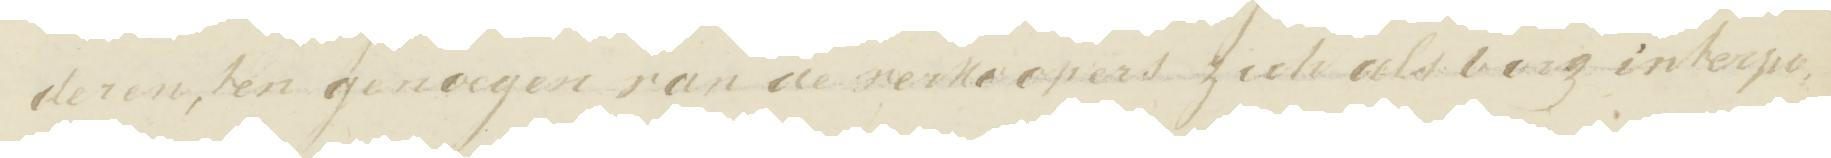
deren, ten genoegen van de verkoopers zich als borg interpo„
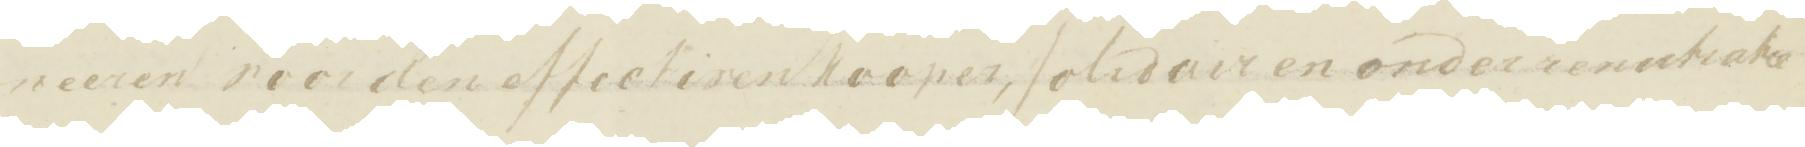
neeren voor den effectiven kooper solidair en onder renuntiatie
